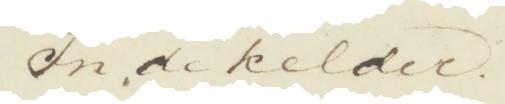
In de kelder.
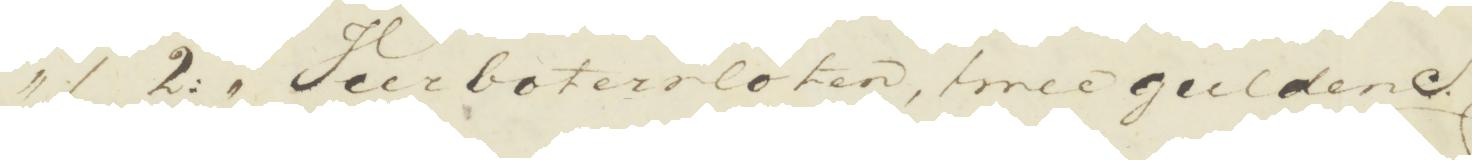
„ 2: „ Vier botervloten, twee guldens.
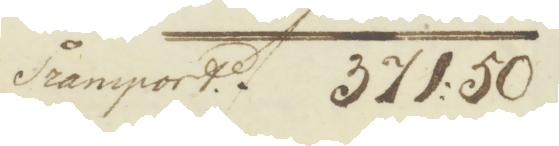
Transport.e ƒ 371: 50
